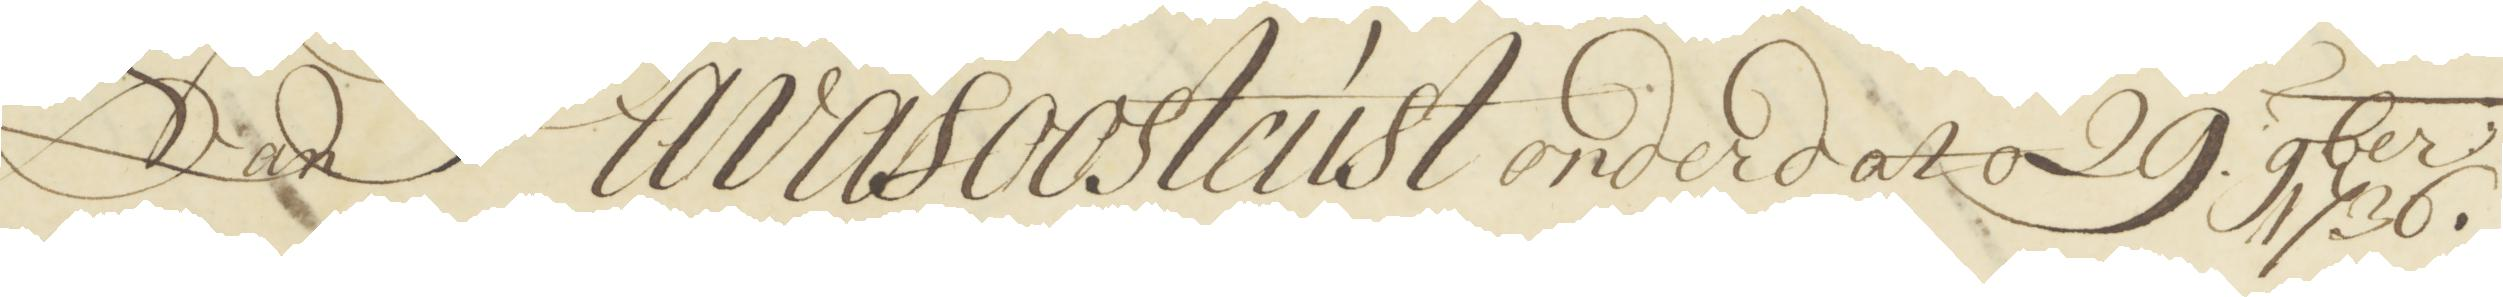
Van Iava's oostcust onder dato 29:' 9ber 1736.
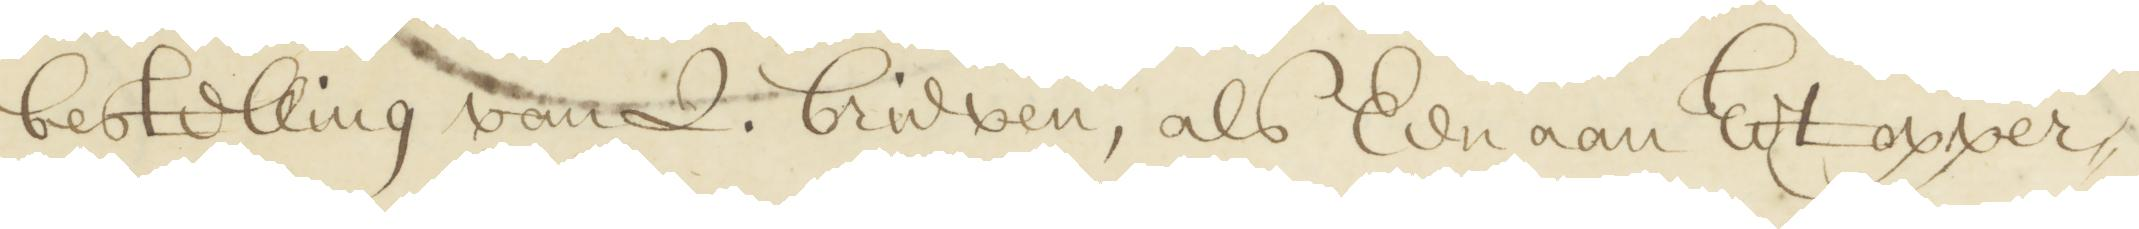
bestelling van 2. brieven, als Een aan het opper„
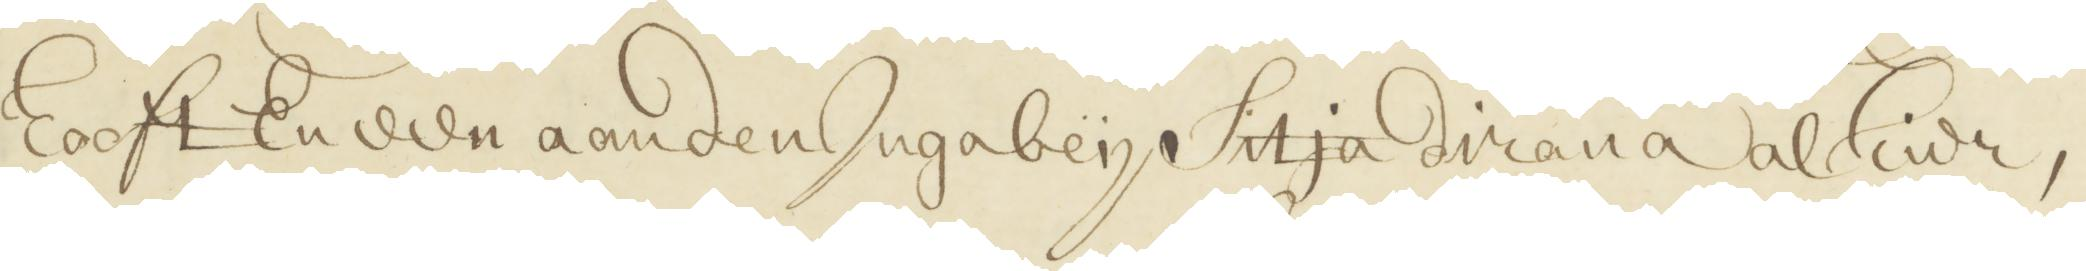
hooft En een aan den Jngabeij sitja dirana alhier,
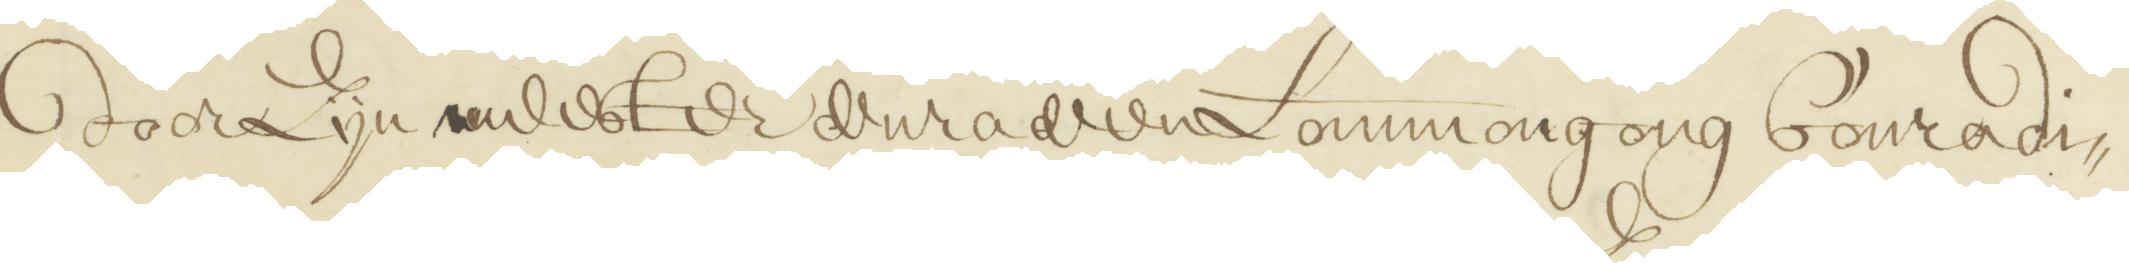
door zijn meester denradeen tommongong souradi„
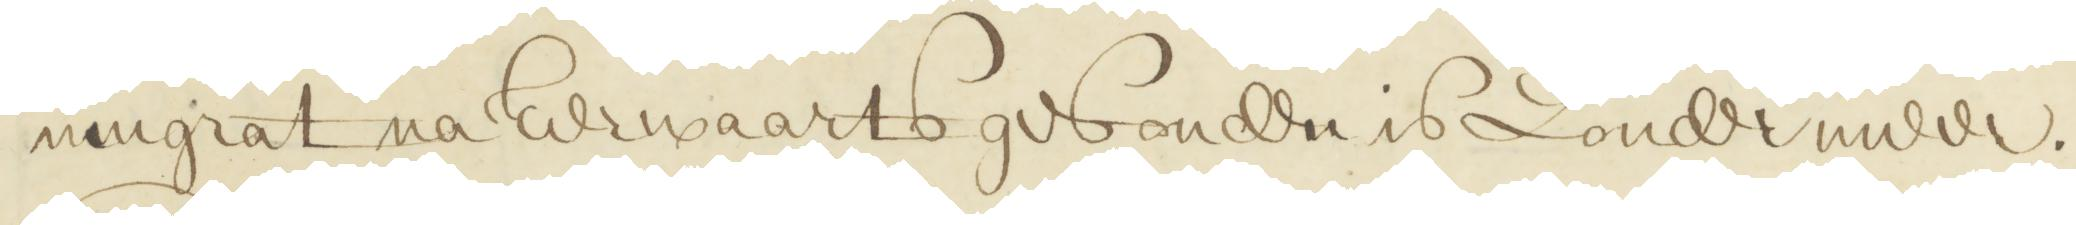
ningrat na herwaarts gesonden is zonder meer.
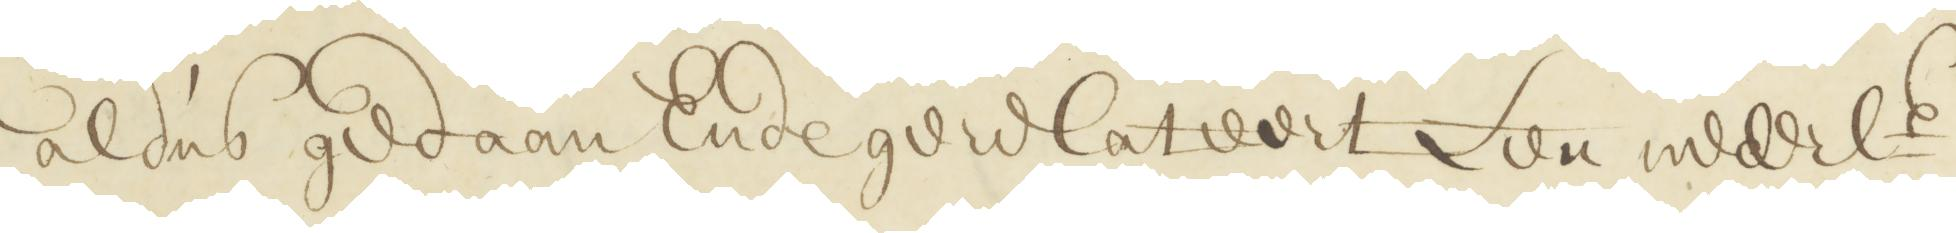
aldus gedaan Ende gerelateert ten nederl=s
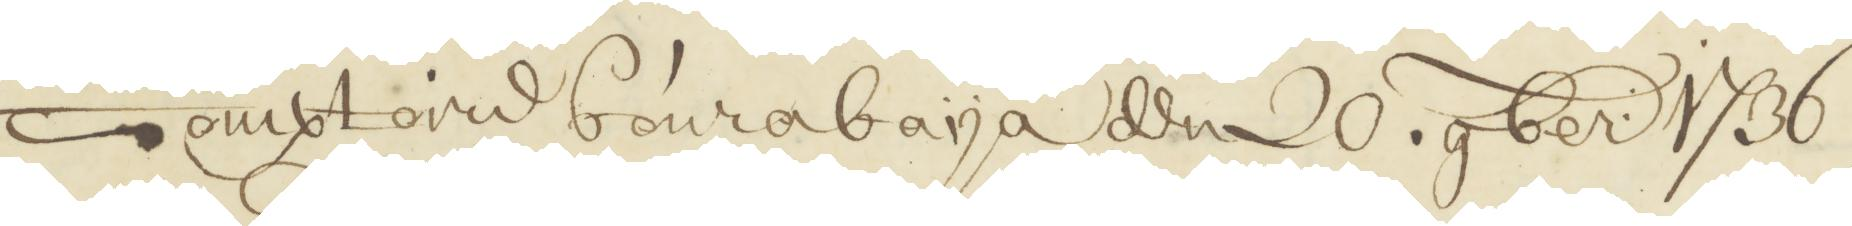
comptoire sourabaija den 20. 9ber: 1736 /
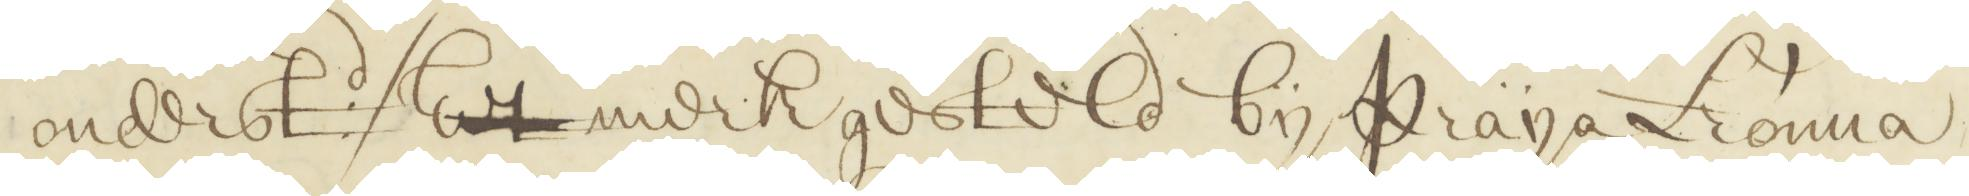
onderst:d/ het merk gesteld bij Praija trouna
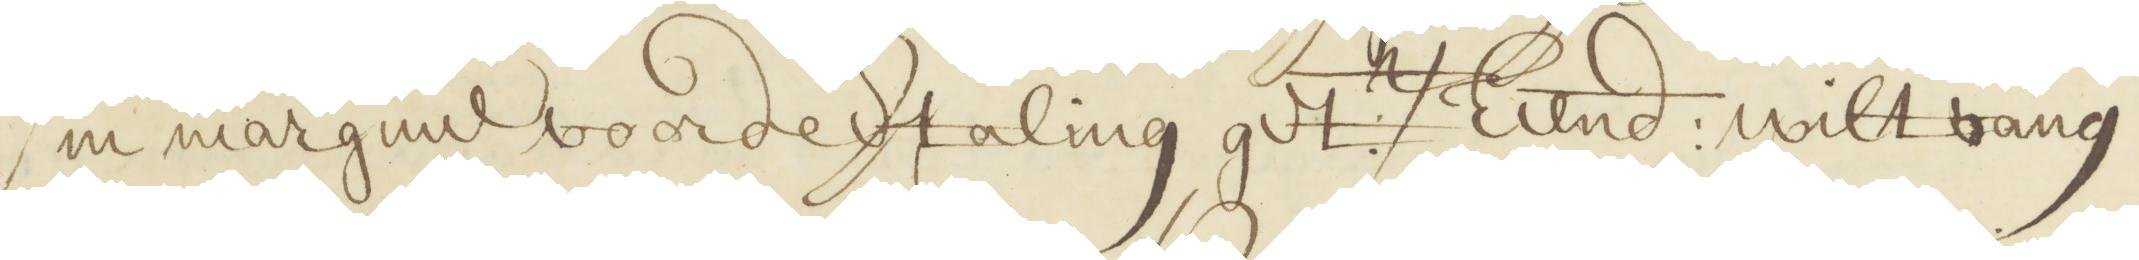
/in margine voor de vertaling get:t/ hend: wiltvang
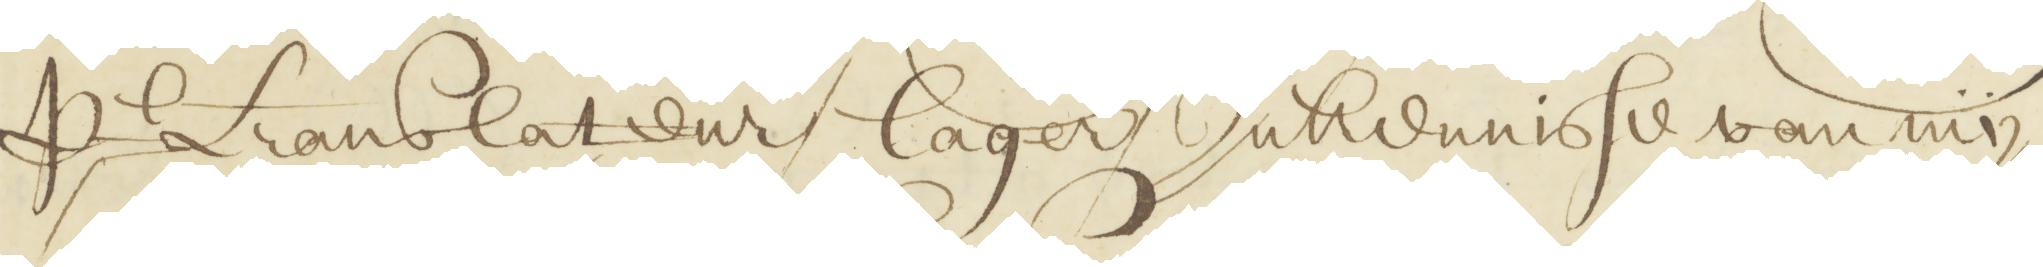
P=l translateur /lager/ Jnkennisse van mij
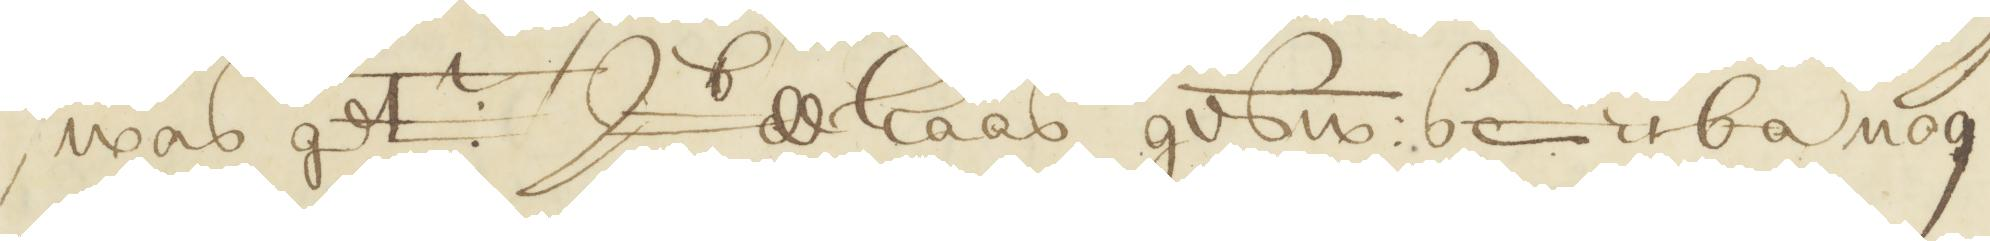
/was get:t/ J=s de haas gesw: scriba nog
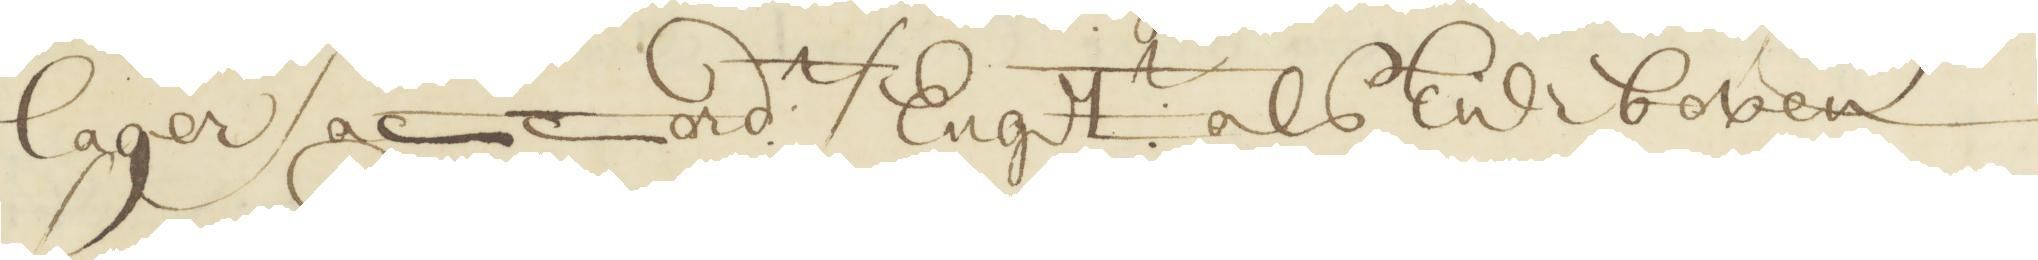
lager /accord:t/ Enget:t als hier boven
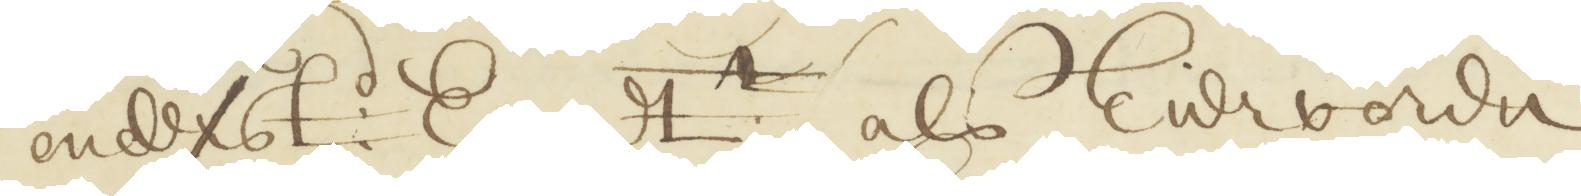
/onderst:d En get:t/ als hiervoren
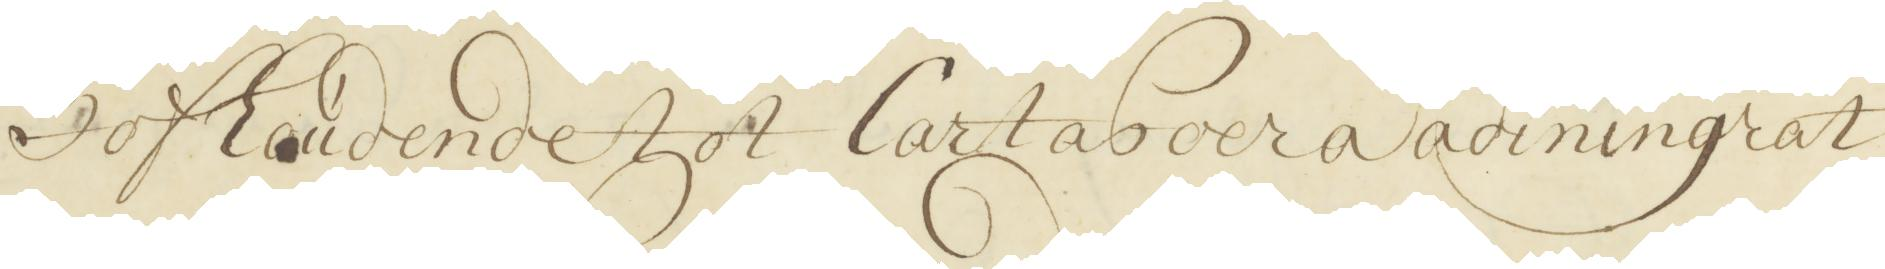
Hof houdende tot Cartasoera adiningrat
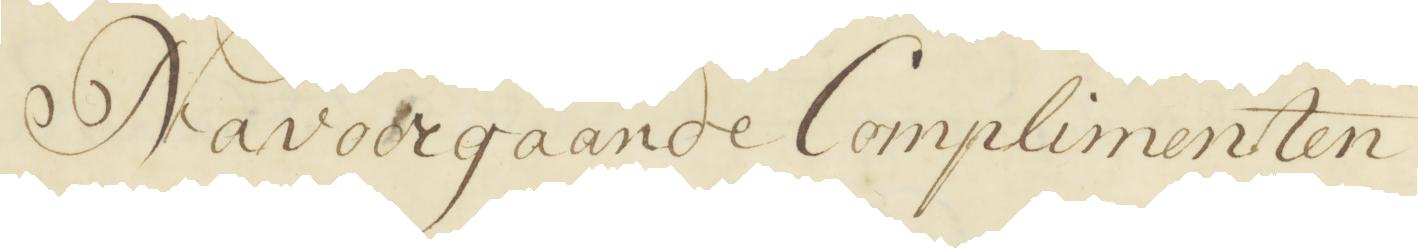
Navoorgaande Complimenten
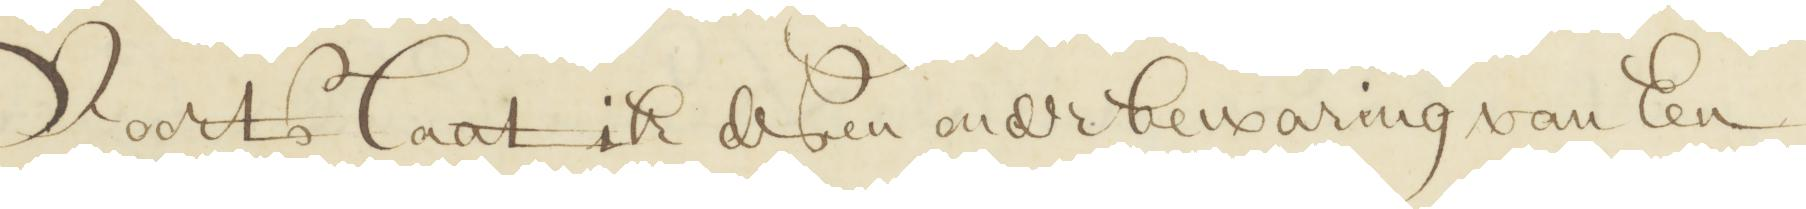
Voorts laat ik desen onder bewaring van Een
